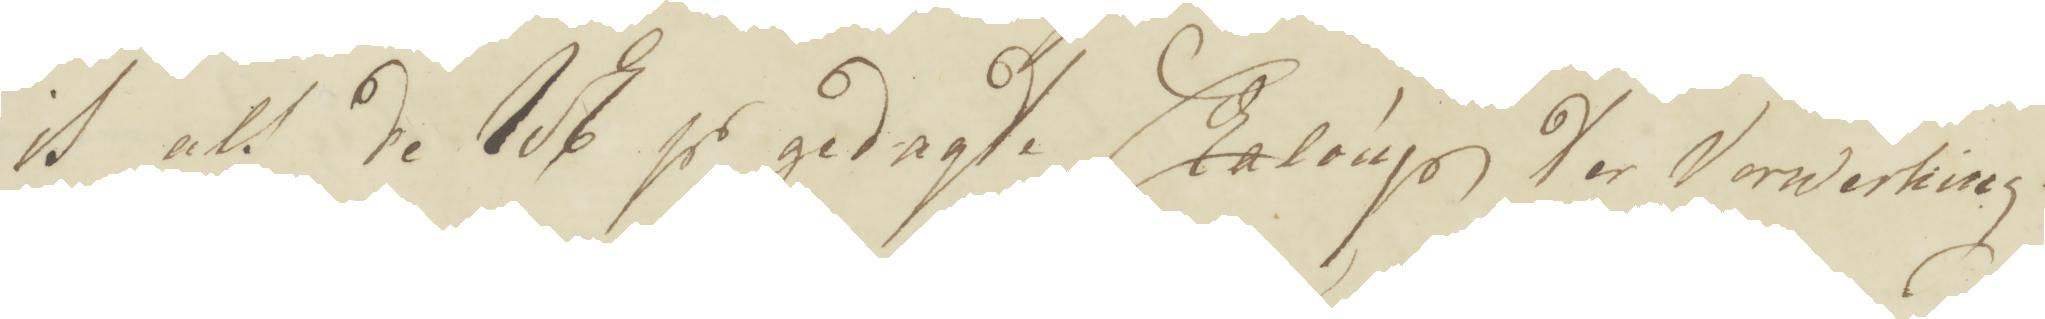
is als de UE pr gedagte Chaloup ter verwerking
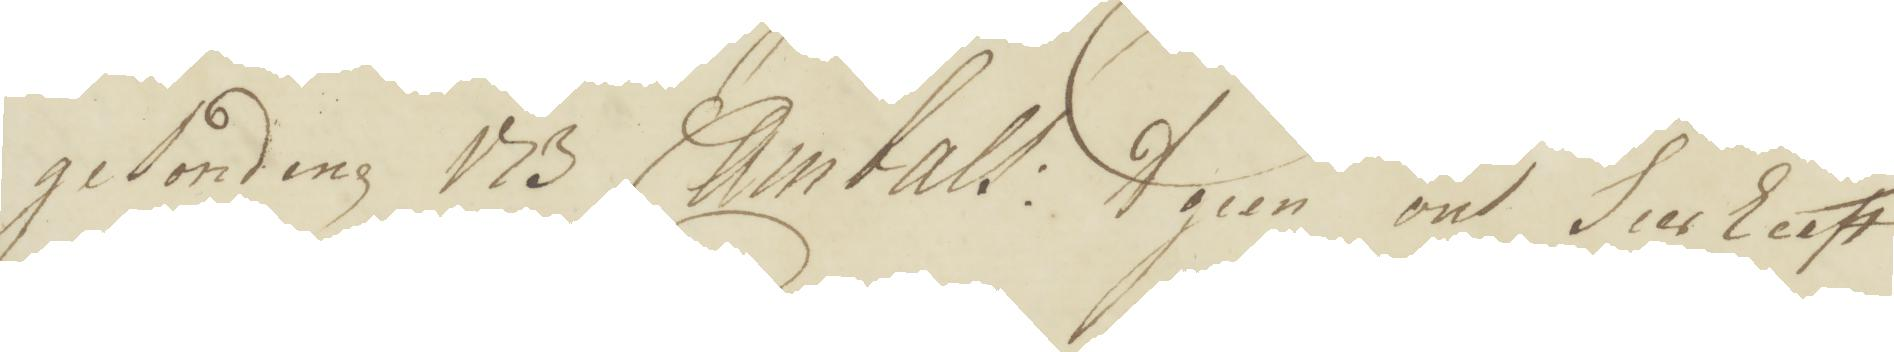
gesondenen 173 Chmbals: t geen ons seer heeft
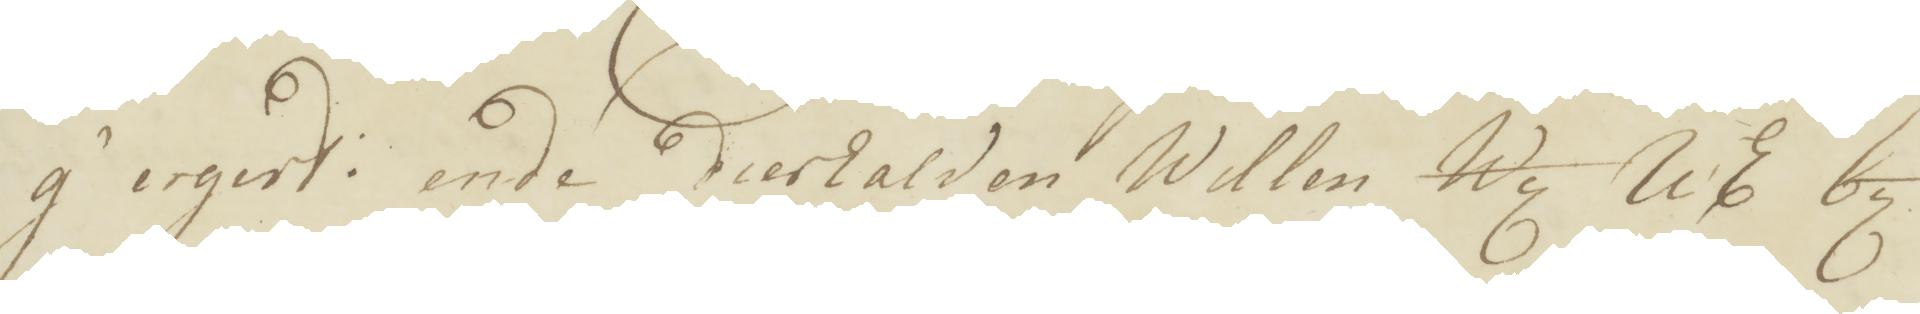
g’ergert: ende dierhalven willen wij UE bij
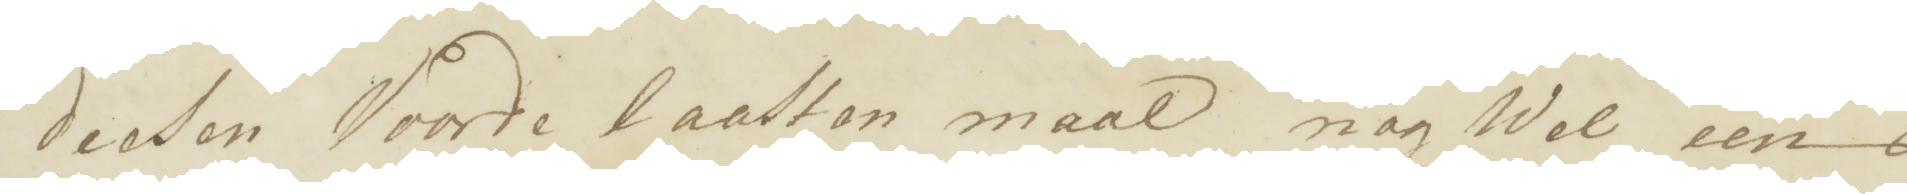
deesen voorde laasten maal nog wel eens
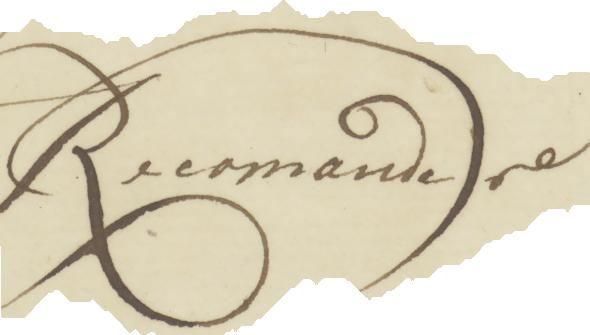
Recomandere
